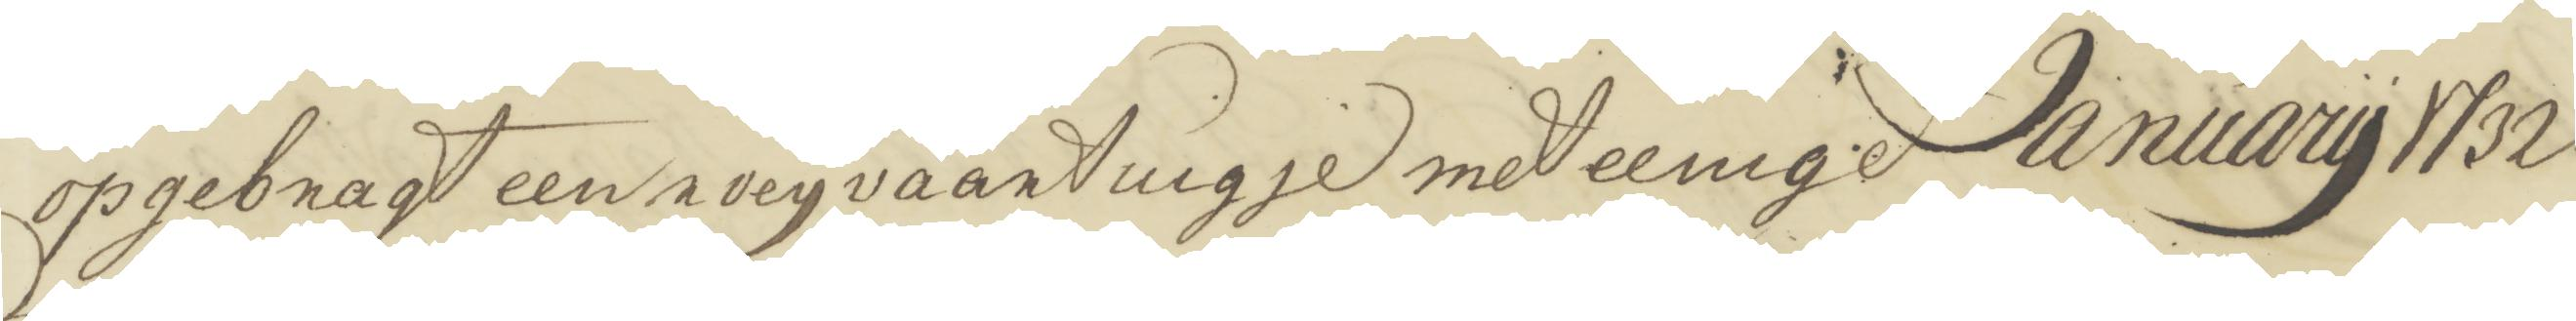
opgebragt een roeijvaartuigje met eenige Januarij 1732
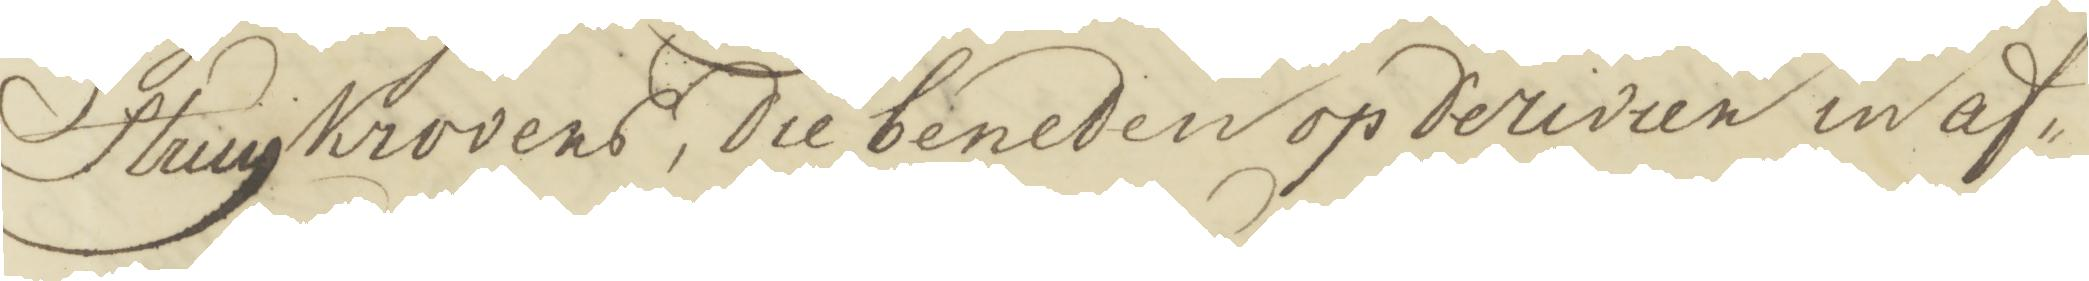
Struijkrovers, die beneden op de rivier in af„
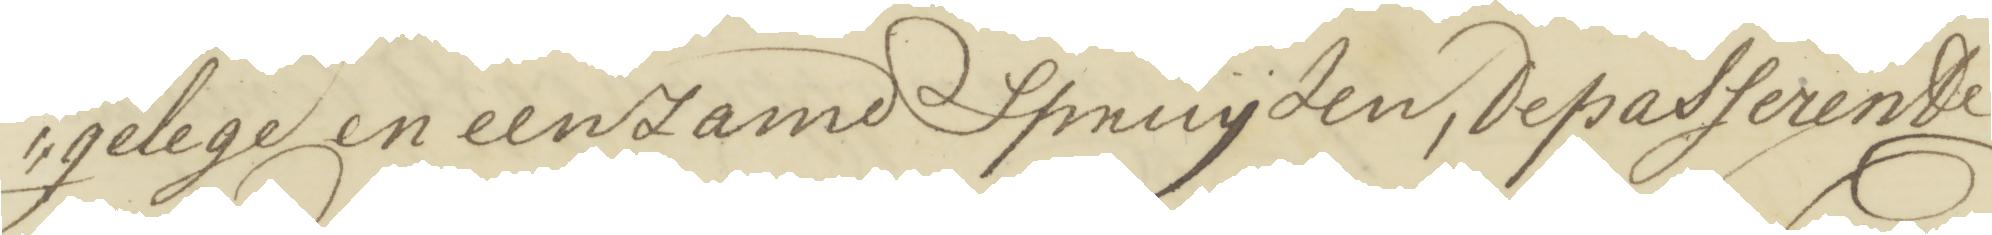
„gelege en eenzame spruijten, de passerende
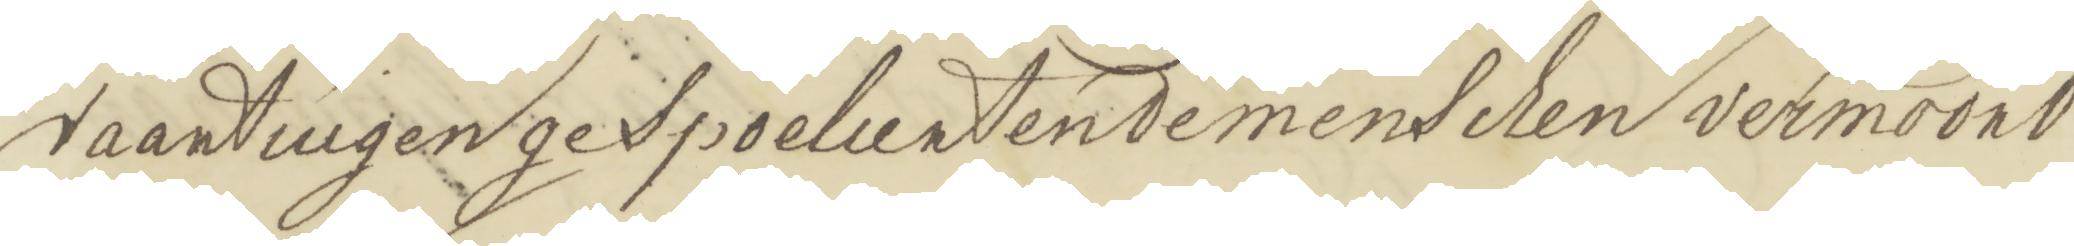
vaartuigen gespoeliert en de menschen vermoord
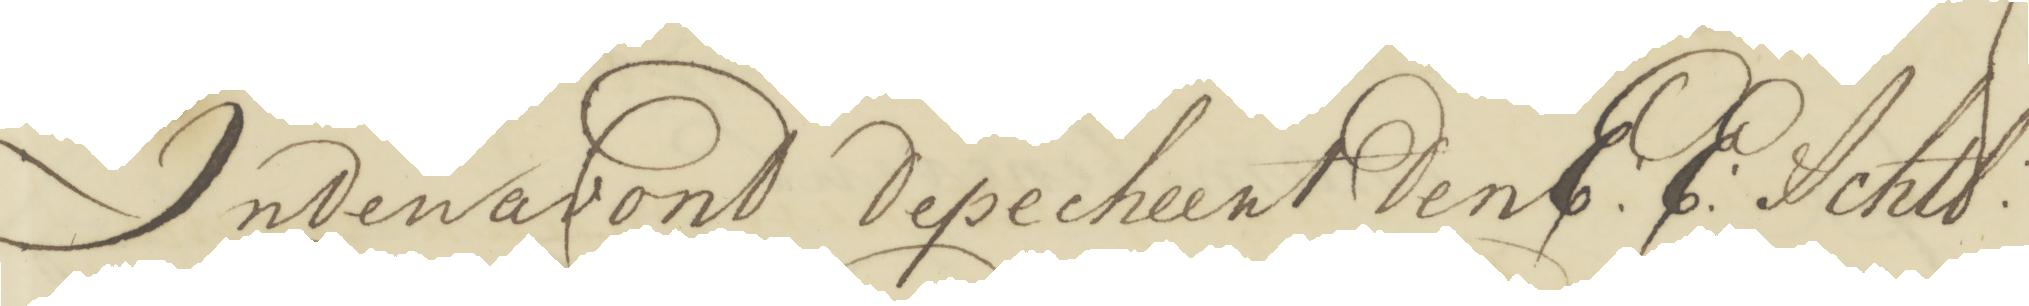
In den avond depecheert den E: E: Achtb:
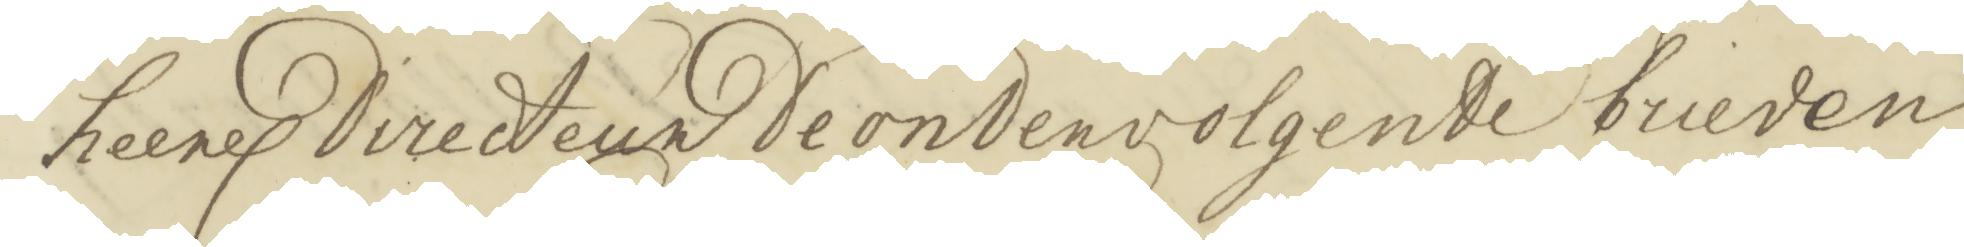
heere Directeur de ondervolgende brieven
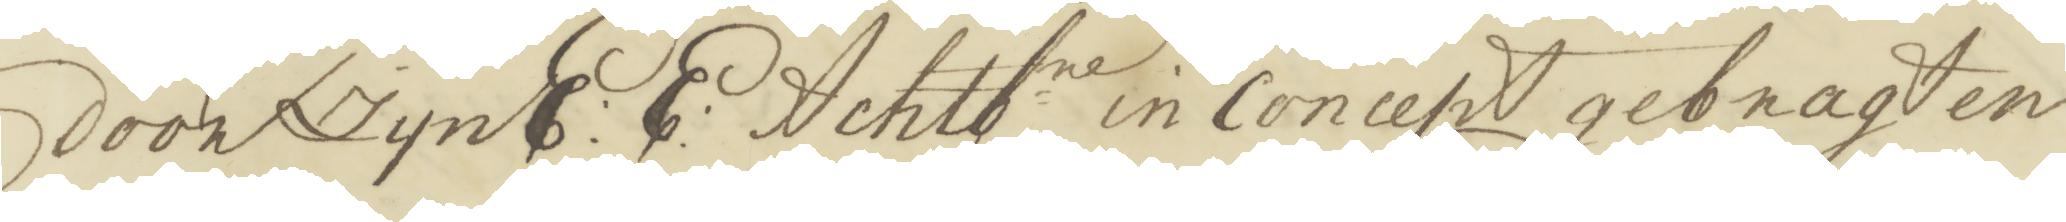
door zijn E: E: Achtb:re in concept gebragt en
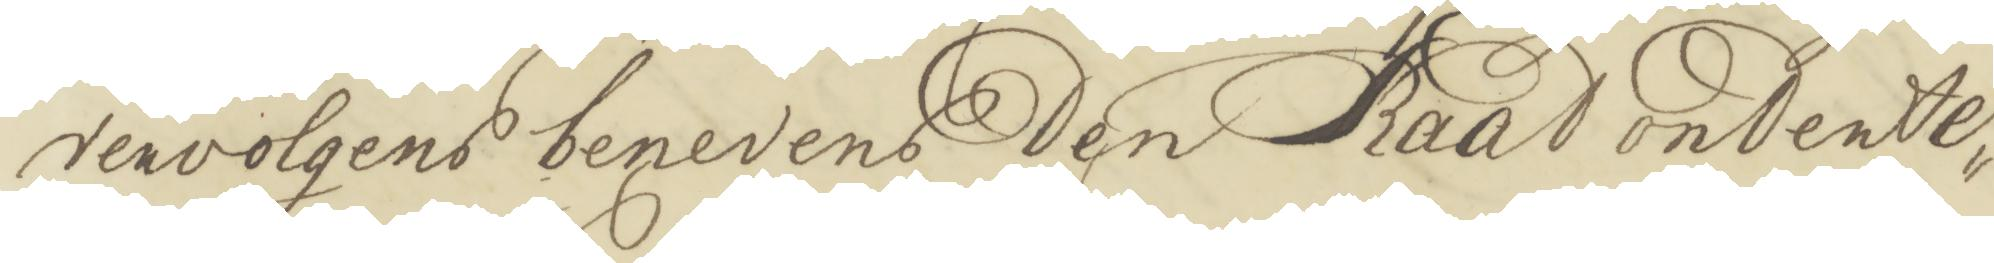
vervolgens benevens den Raad onderte„
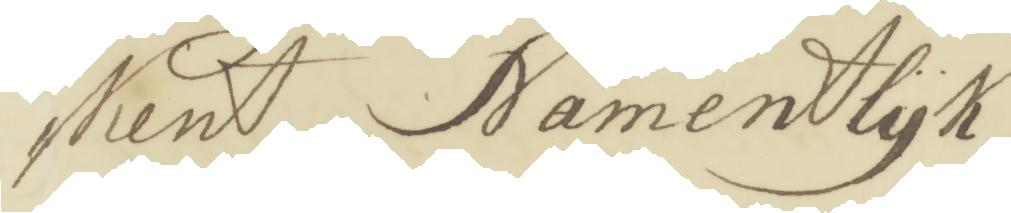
Kent Namentlijk
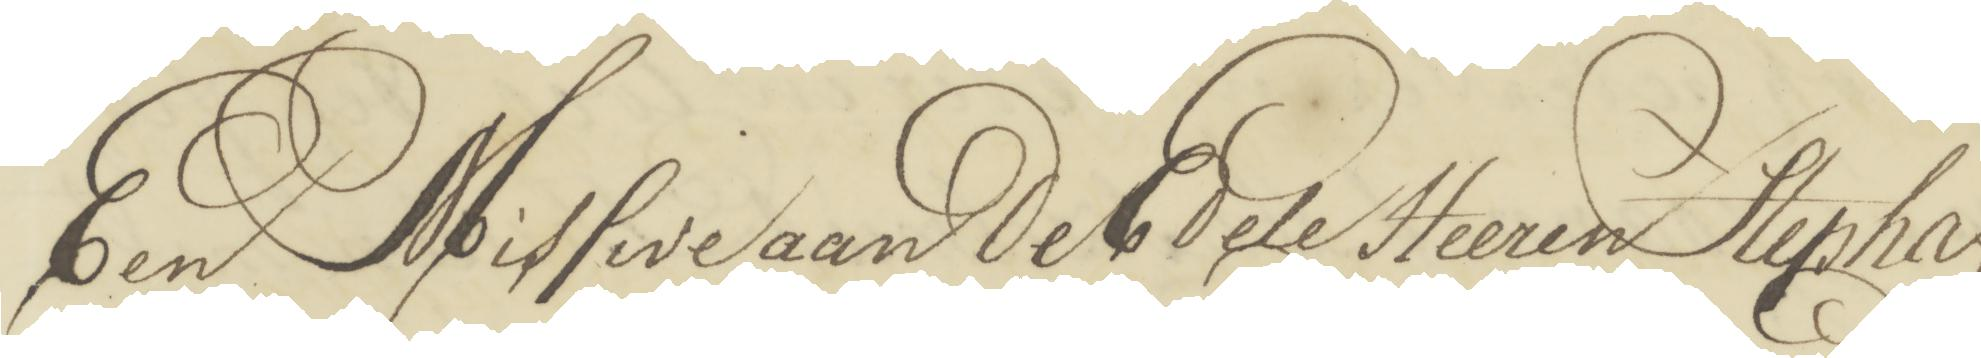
Een Missive aan de Edele Heeren Stepha
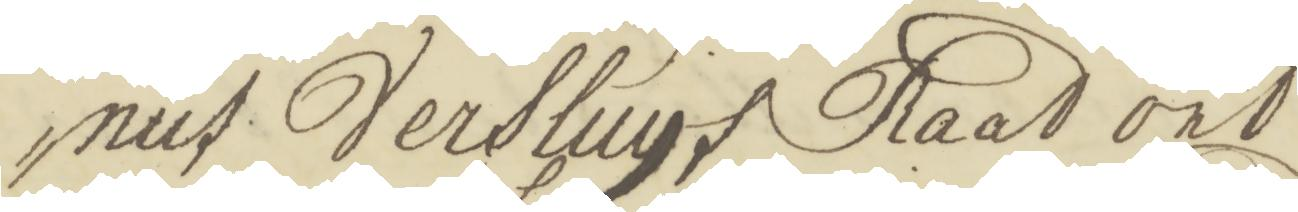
„nus: Versluijs Raad ord=r
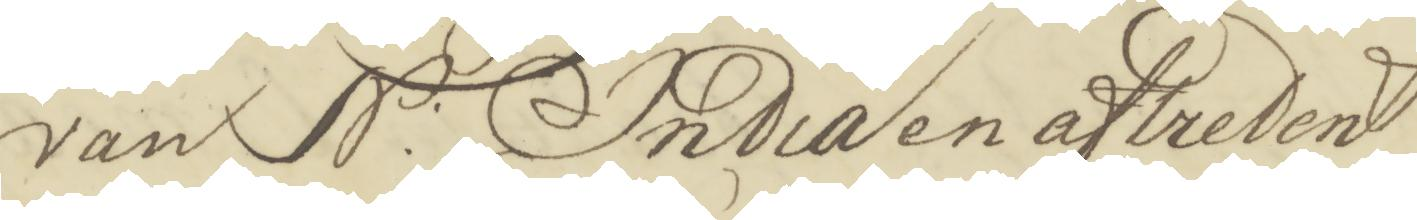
van N:s India en aftredent
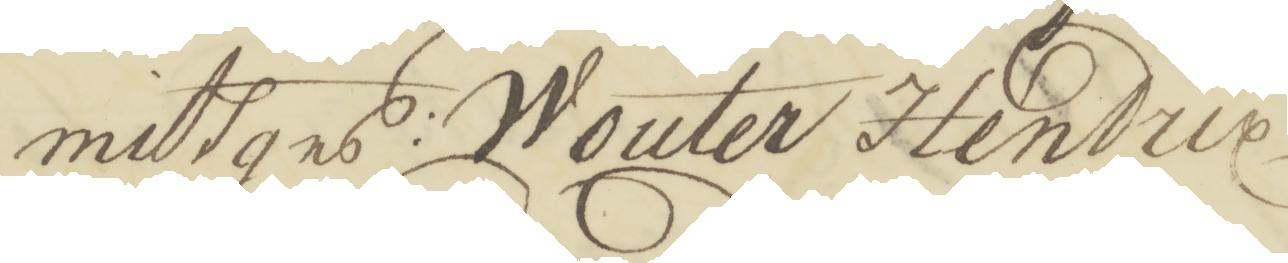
mitsgrs: Wouter Hendrix
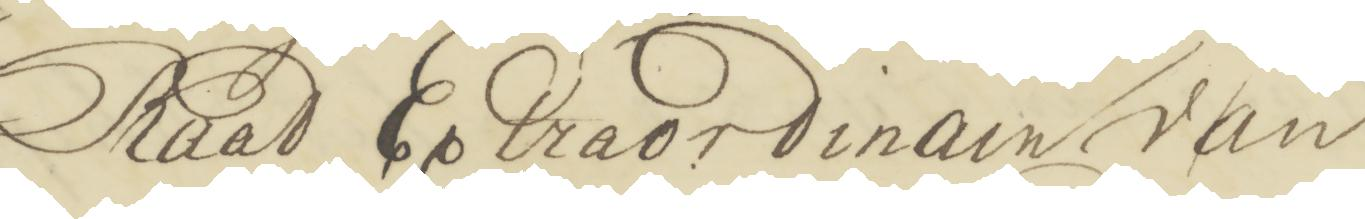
Raad Extraordinair van
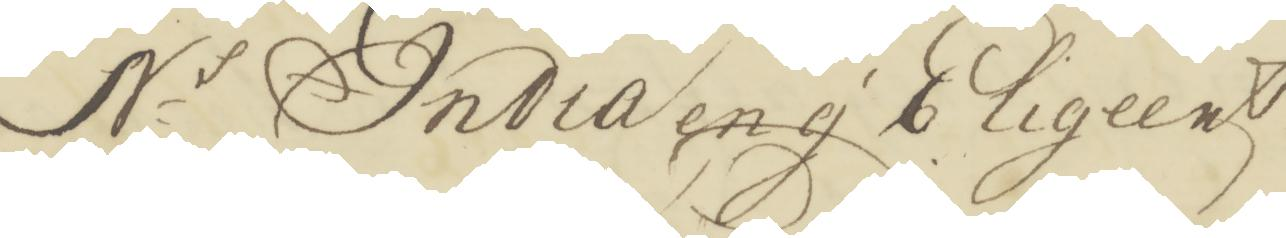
N=s India en g’ Eligeert
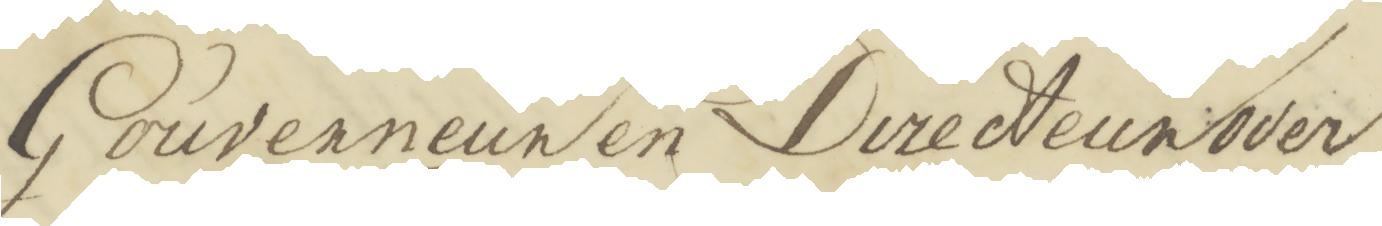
Gouverneur en Directeur over
